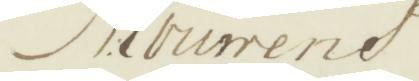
Bouwens
